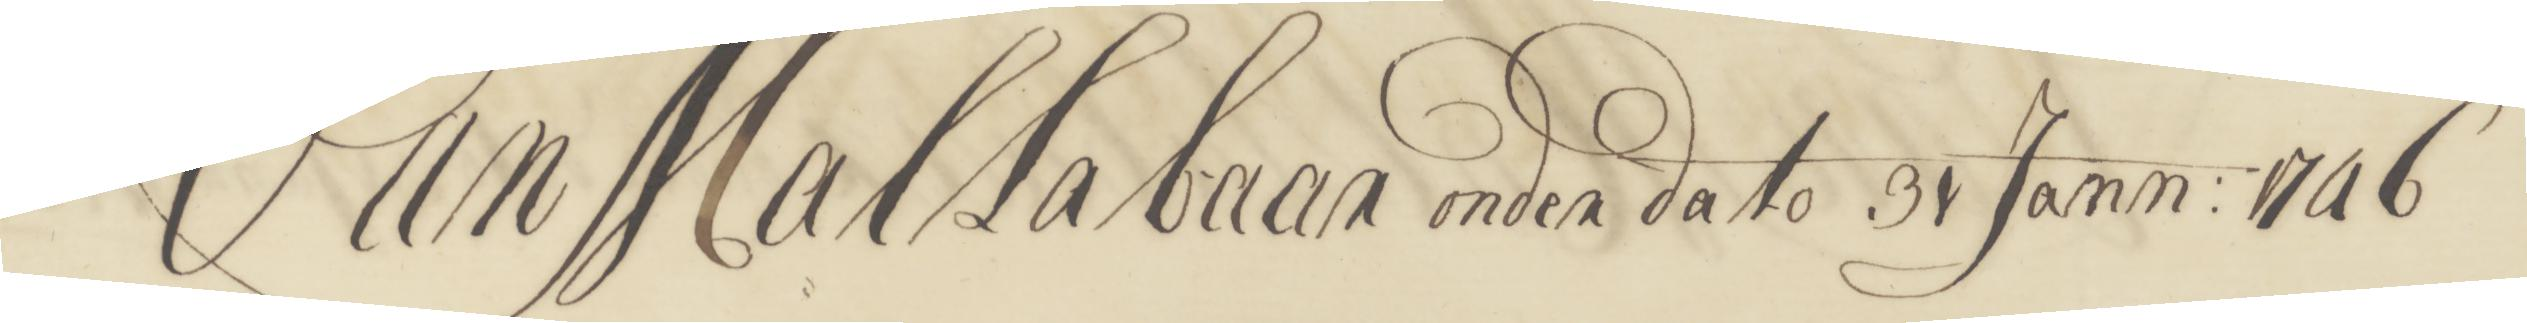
Van Mallabaar onder dato 31 Jann: 1746
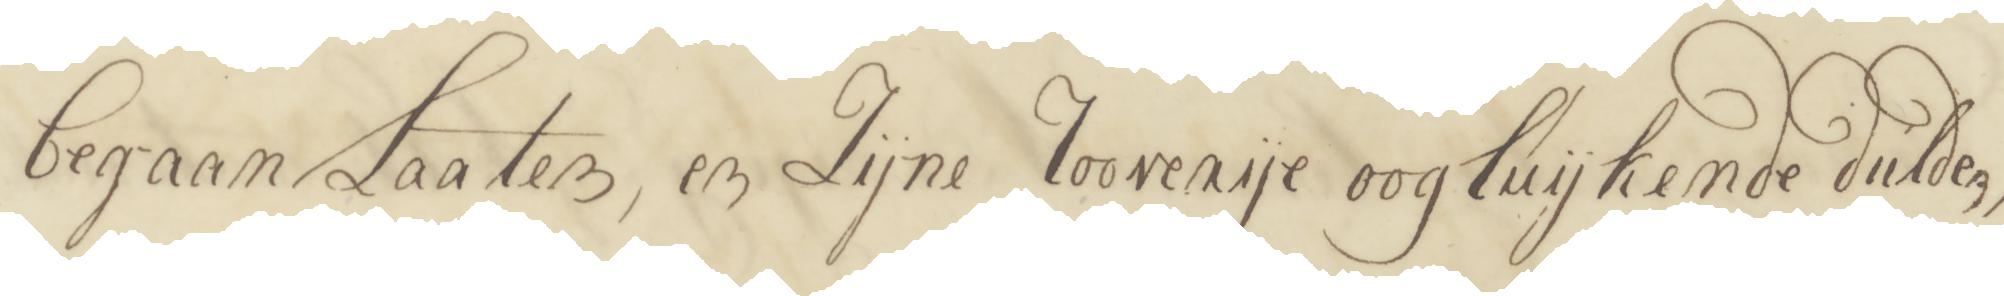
begaan laaten, en zijne rooverije oogluijkende dulden,
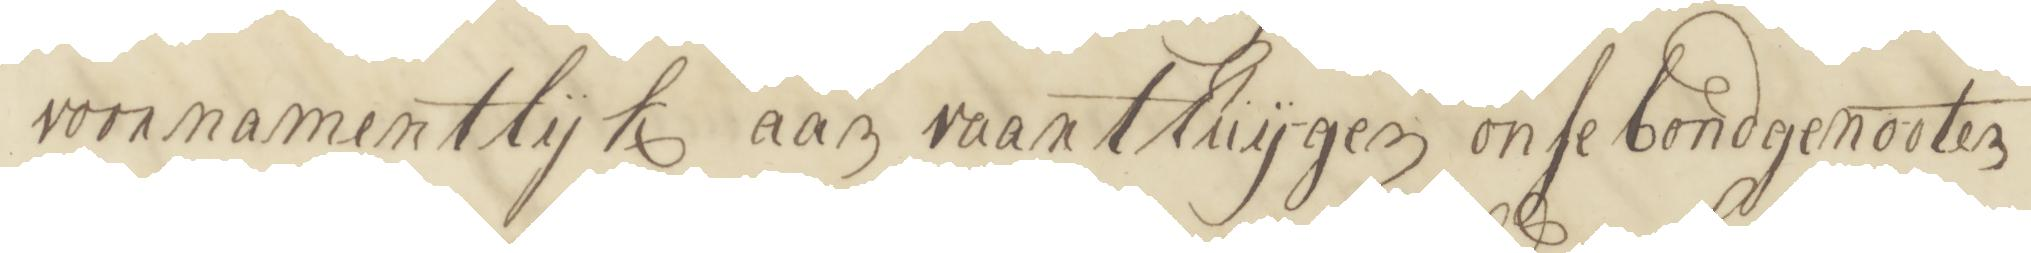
voornamentlijk aan vaarthuijgen onse bondgenooten
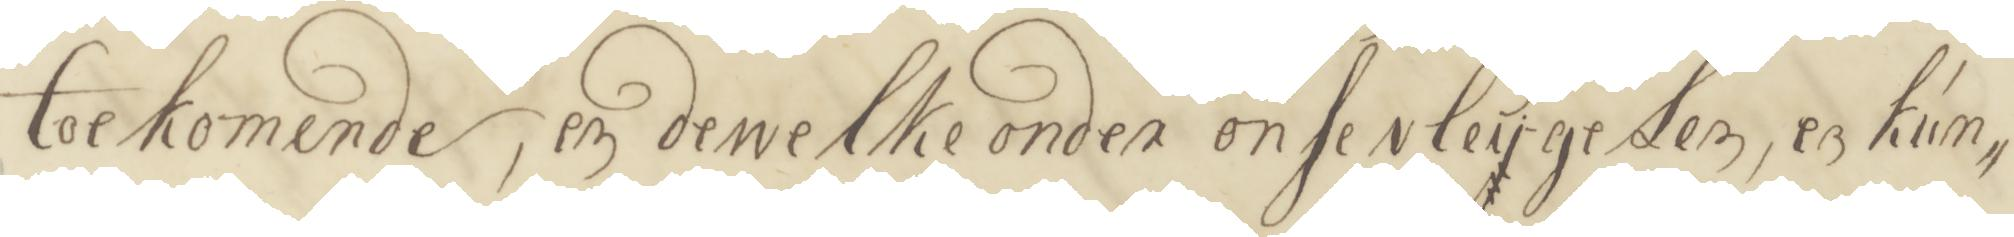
toekomende, en dewelke onder onse vleugelen, en kun„
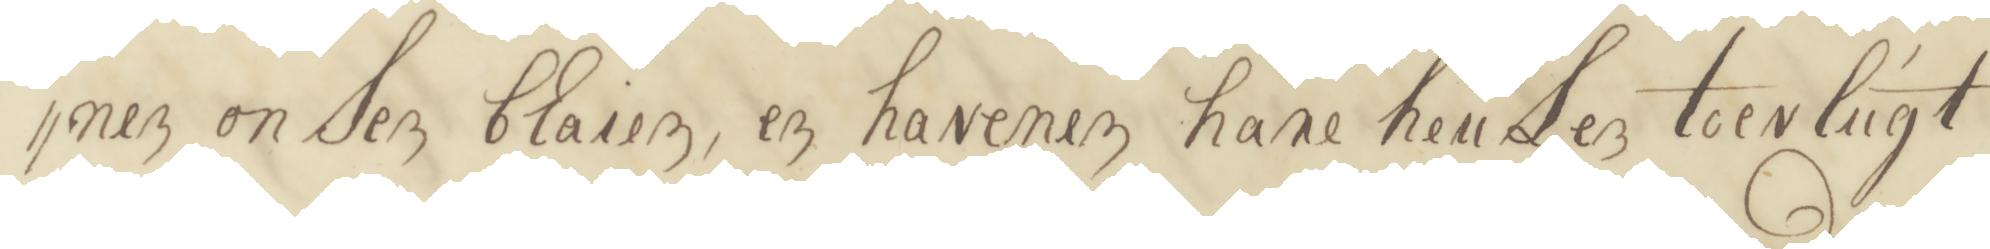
„nen onsen bhaien, en havenen hare keusen toevlugt
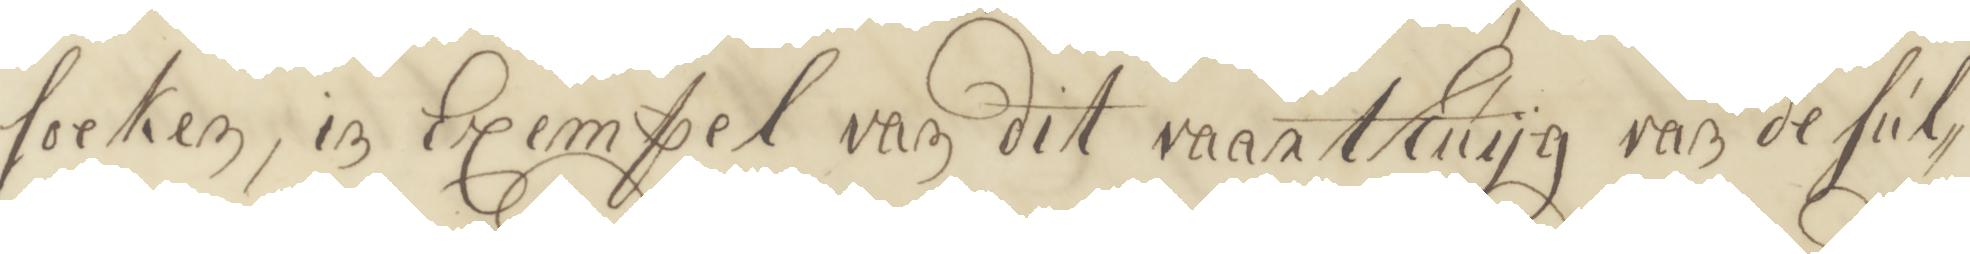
soeken, in Exempel van dit vaarthuijg van de sul„
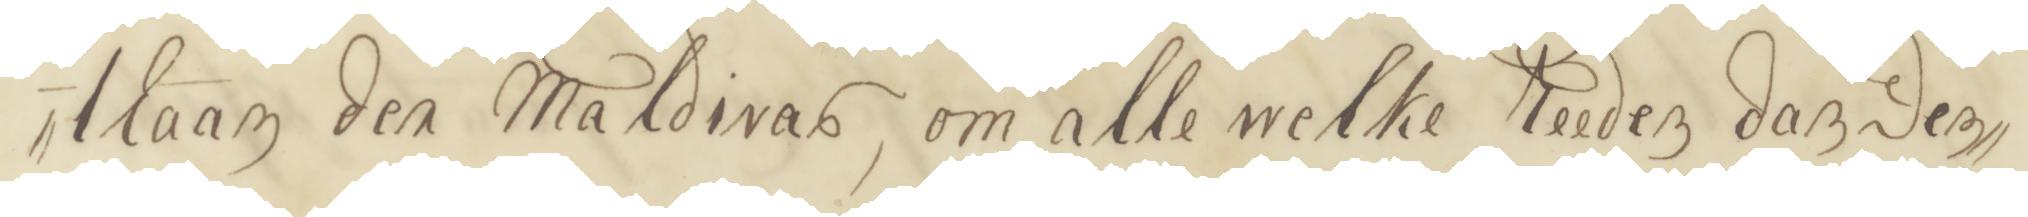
„thaan der Maldivas, om alle welke reeden dan Een„
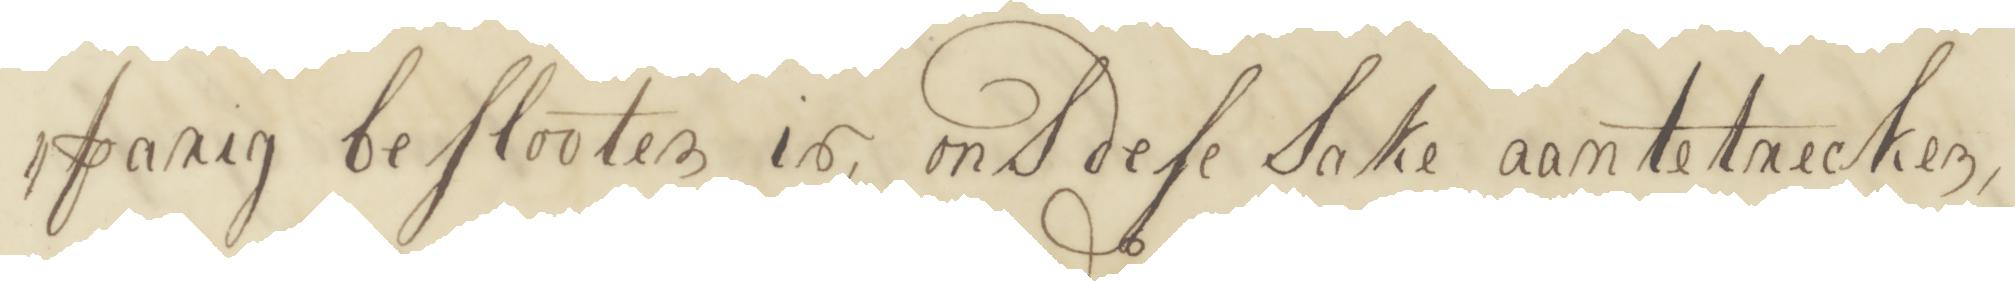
„parig beslooten is, ons dese sake aan te trecken,
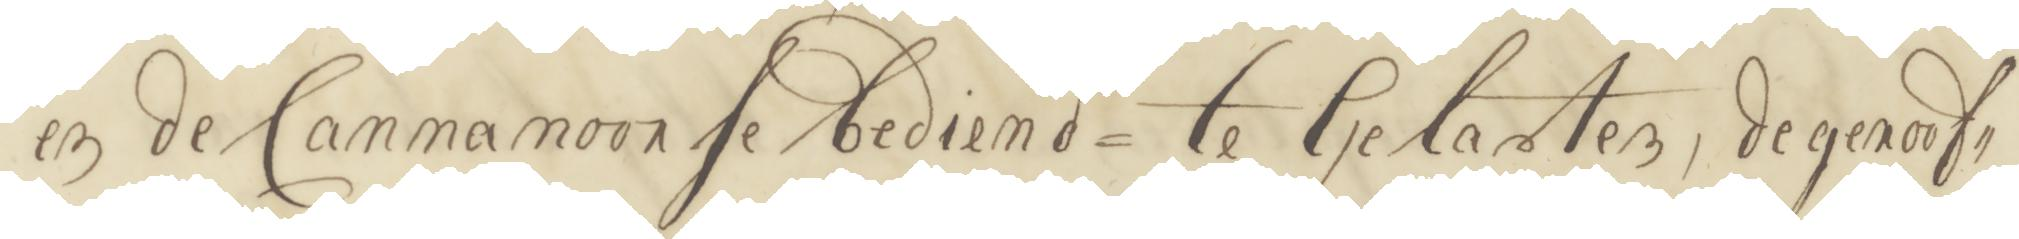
en de Cannanoorse bediend=s te Gelasten, de geroof„
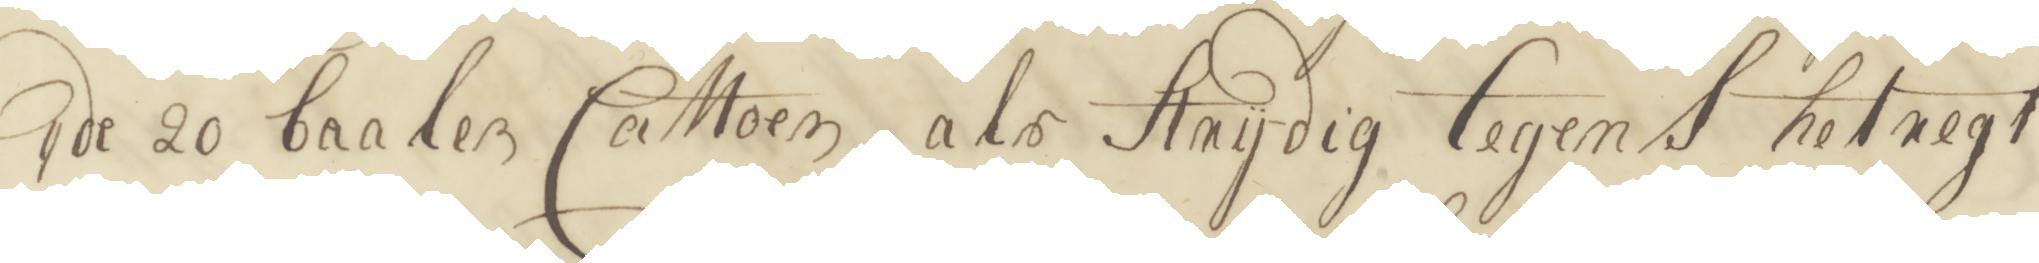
de 20 baalen Cattoen, als strijdig tegens het regt
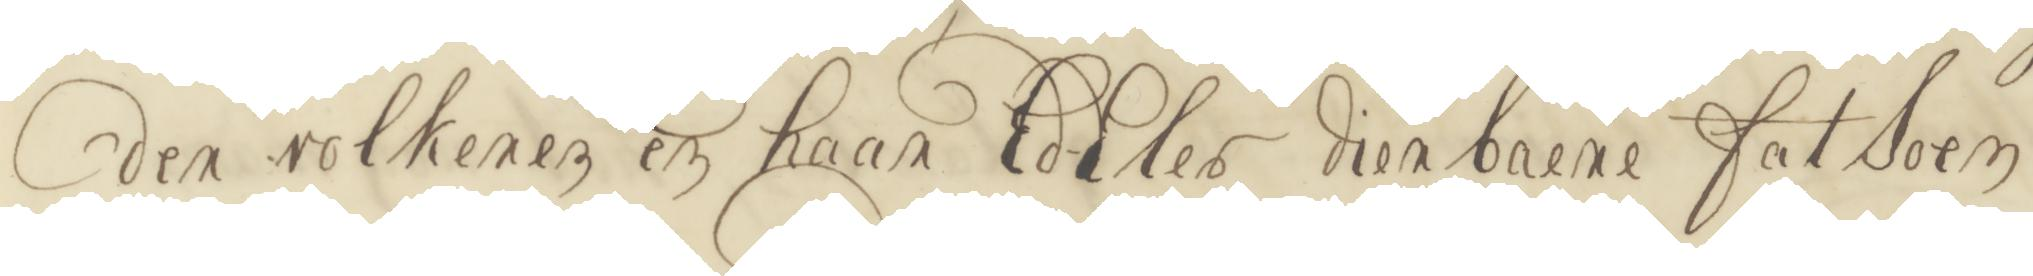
der volkeren en haar Edeles dierbaere fatsoen
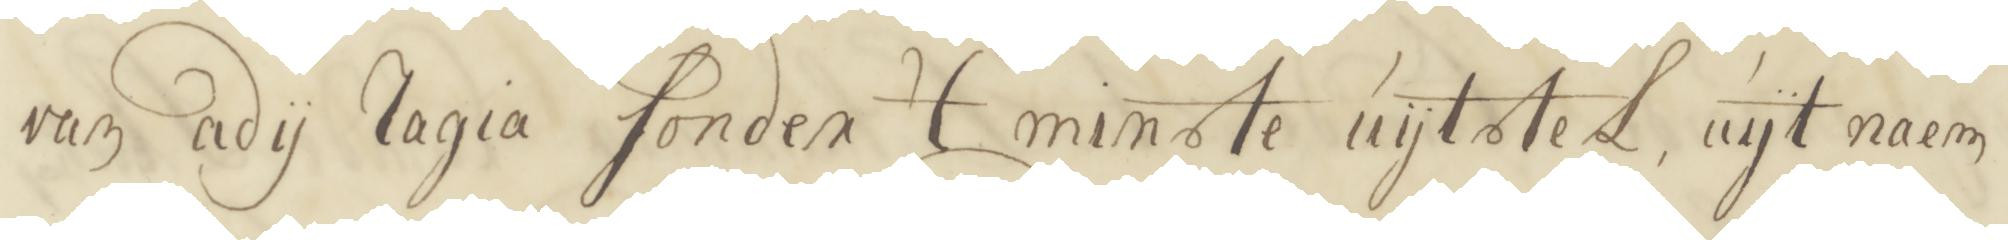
van adij ragia sonder ’t minste uijtstel, uijt naem
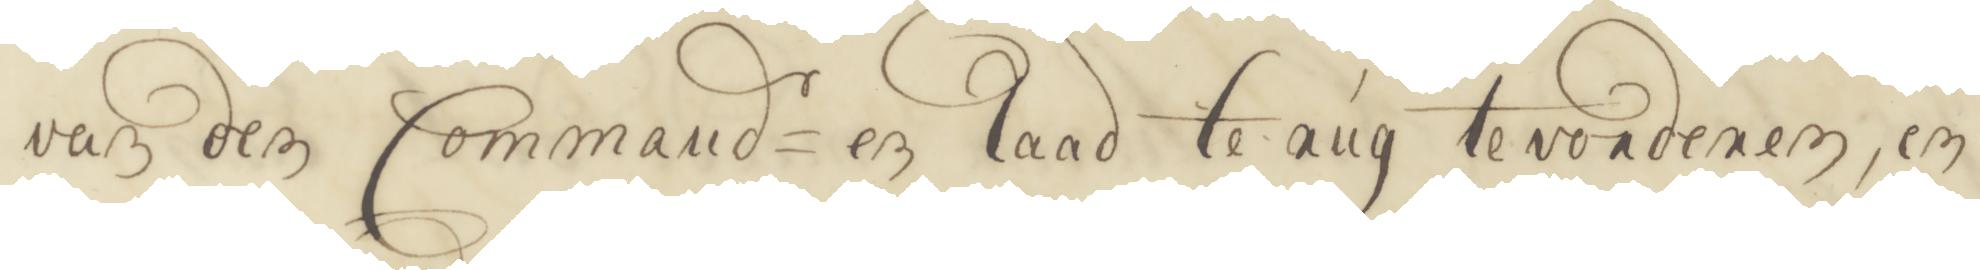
van den Command=r en Raad te rug te vorderen, en
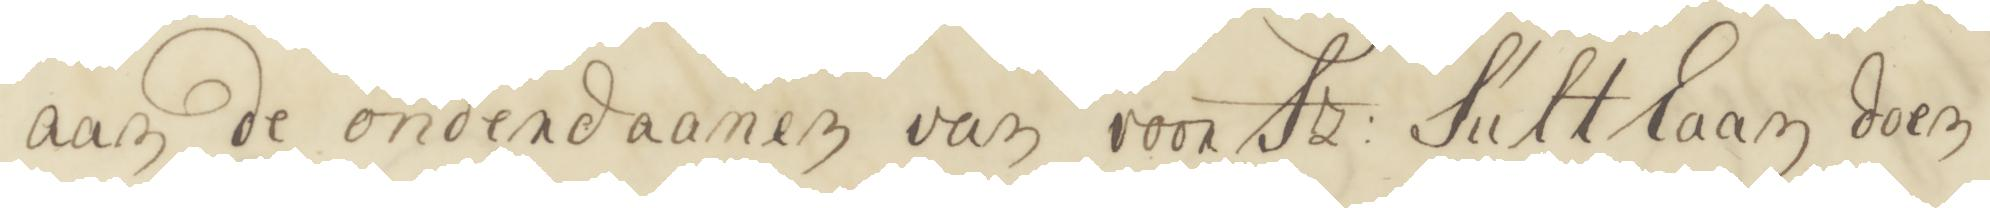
aan de onderdaanen van voorsz: sulthaan doen
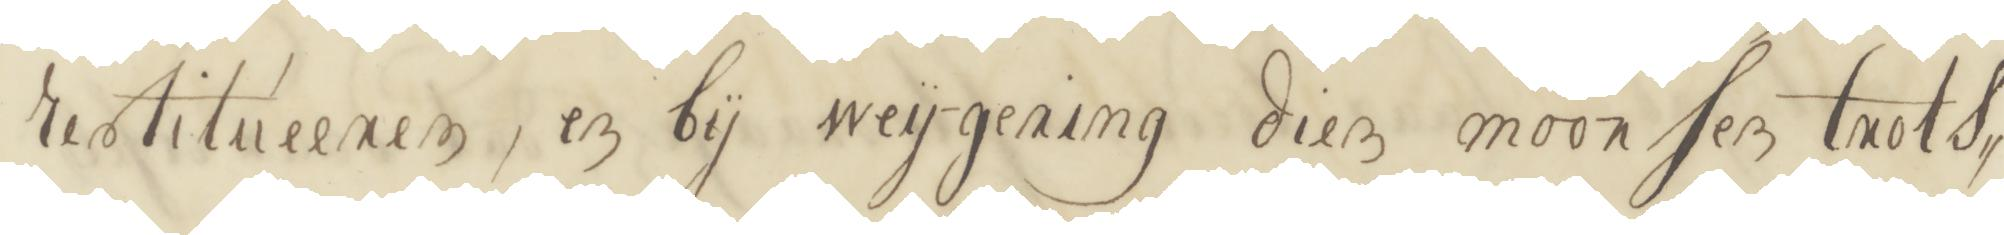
restitueeren, en bij weijgering dien moorsen trots„
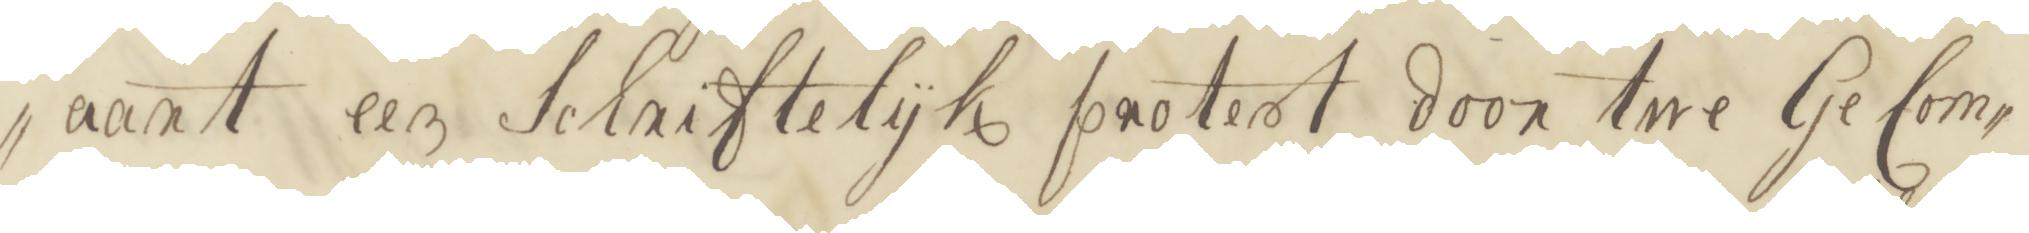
„aart een schriftelijk protest door twe Gecom„
